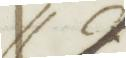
„ 9
